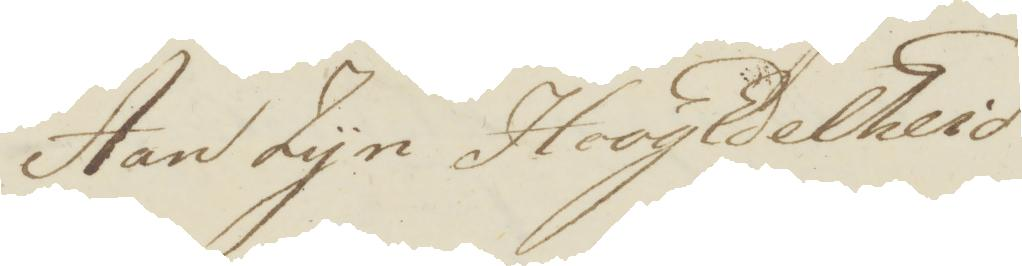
Aan Zijn Hoog Edelheid
